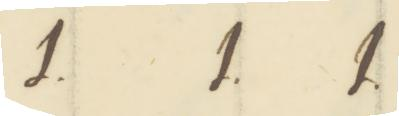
1. 1. 1.
